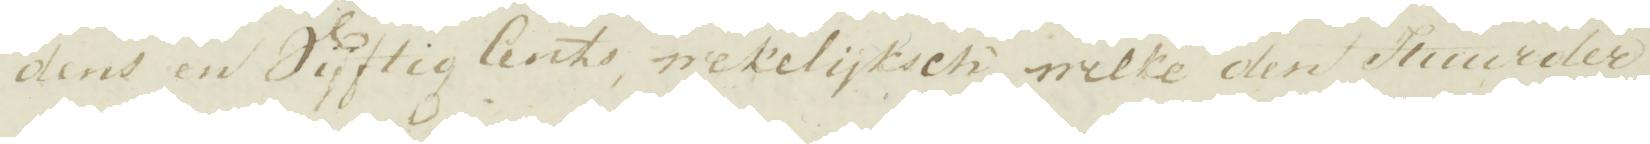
dens en Vijftig Cents, wekelijksch, welke den Huurder
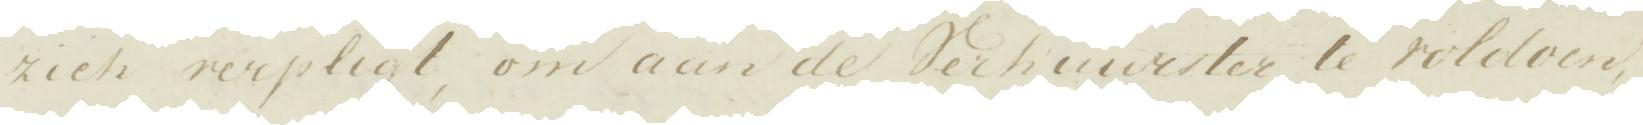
zich verpligt, om aan de Verhuurster te voldoen,
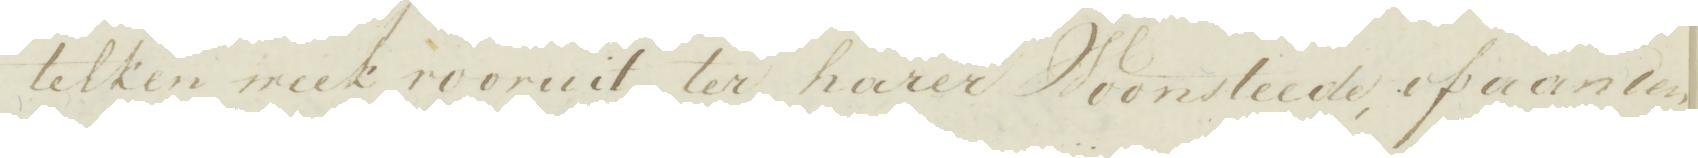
telken week vooruit, ter harer Woonsteede, op aan ten
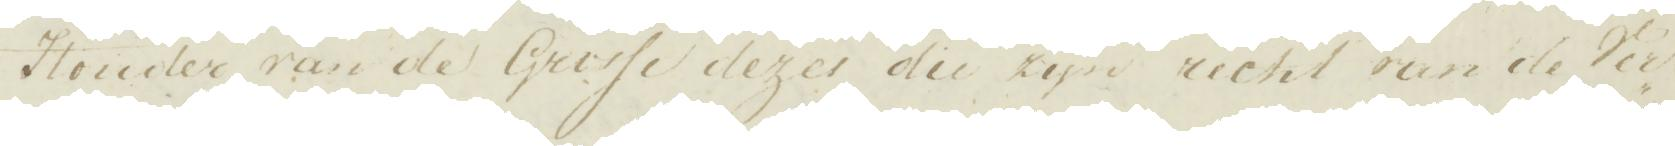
Houder, van de Grosse dezes, die zijn recht van de Ver„
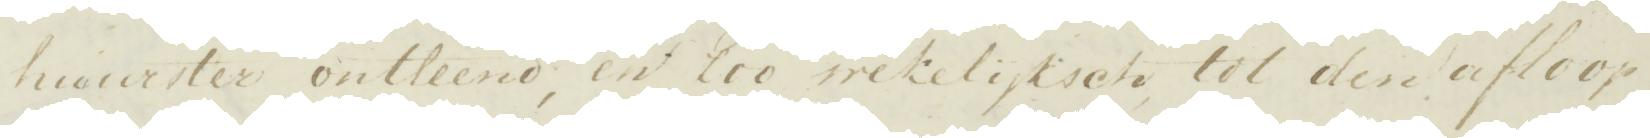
huurster ontleend, en zoo wekelijksch, tot den afloop
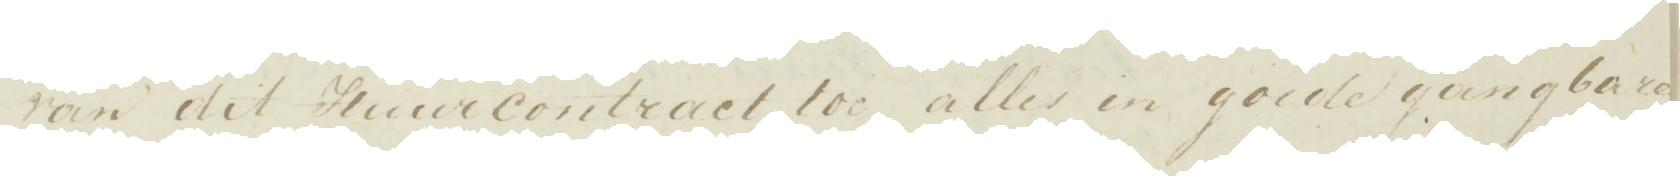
van dit Huur contract toe, alles in goede gangbare
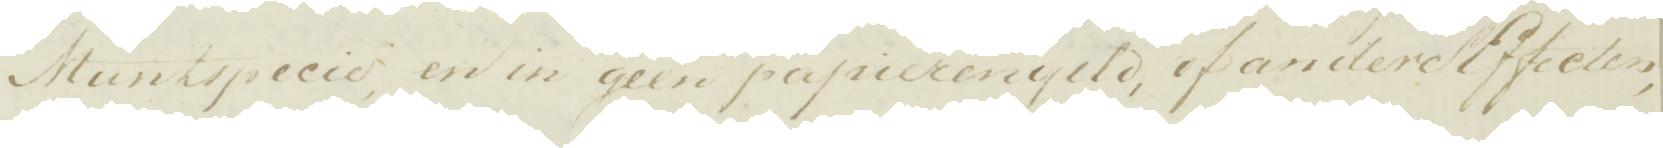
Muntspecie, en in geen papieren geld, of andere Effecten,
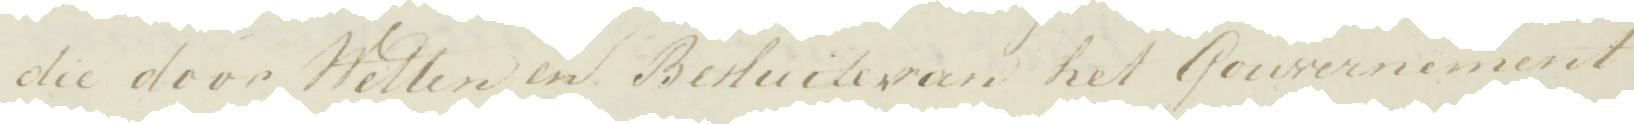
die door Wetten, en Besluiten van het Gouvernement
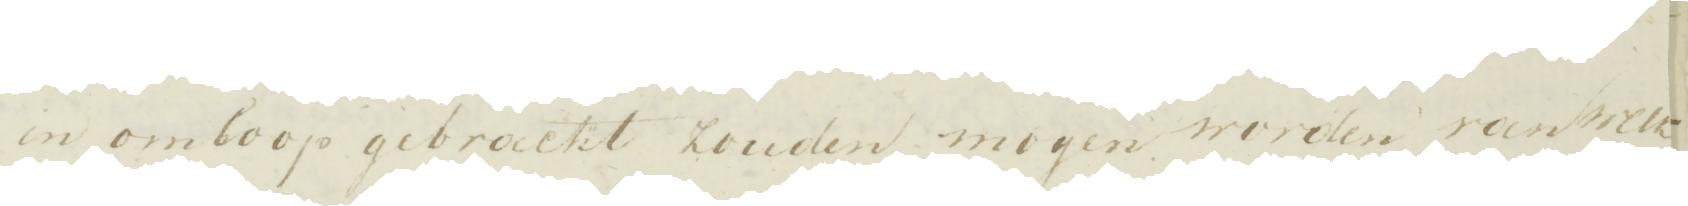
in omloop gebracht zouden mogen worden, van welk
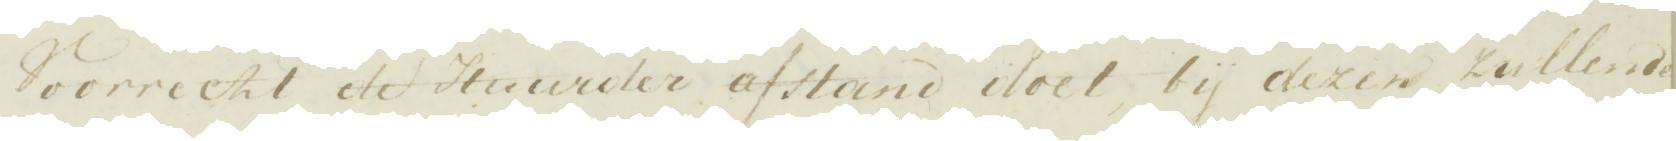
Voorrecht de Huurder afstand doet bij dezen, zullende
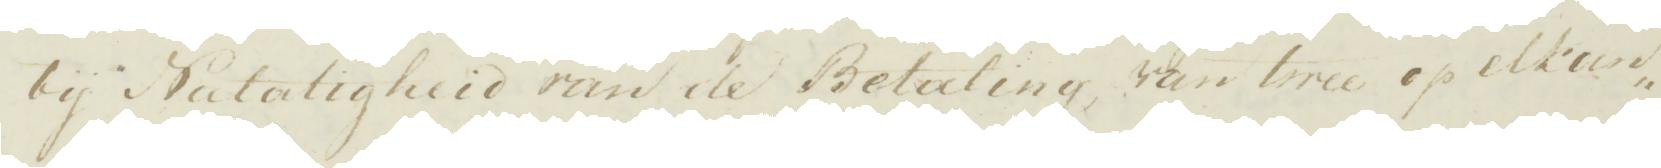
bij Nalatigheid van de Betaling, van twee op elkan„
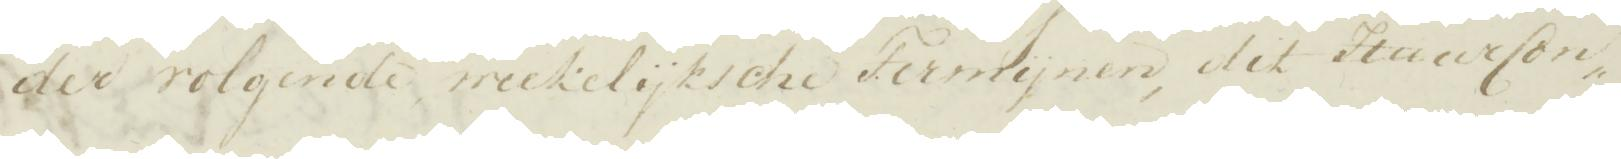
der volgende weekelijksche Termijnen, dit Huur Con„
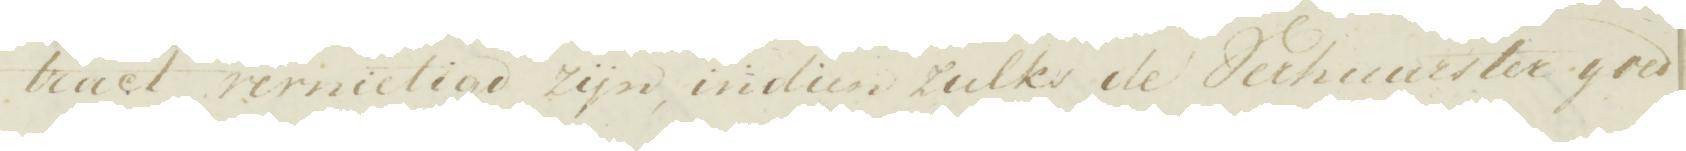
tract vernietige zijn, indien zulks de Verhuurster goed
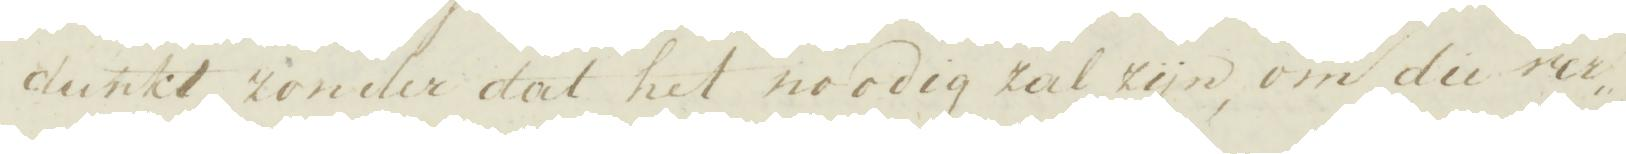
dunkt, zonder dat het noodig zal zijn, om die ver„
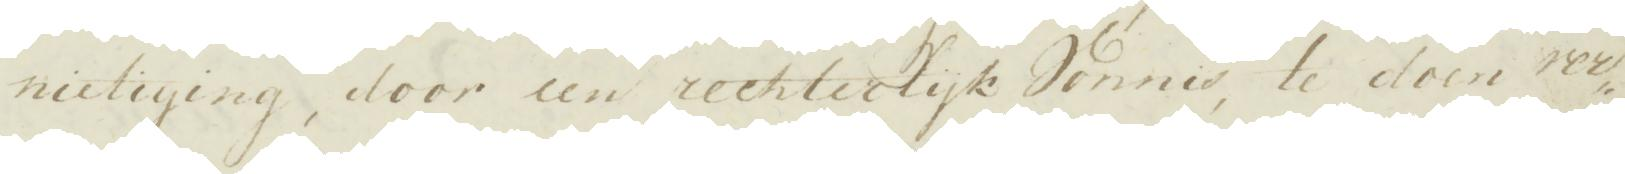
nietiging, door een rechterlijk Vonnis, te doen ver„
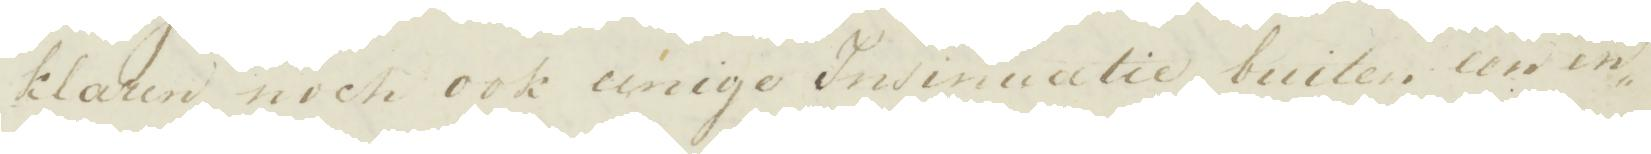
klaren, noch ook eenige Insinuatie, buiten een en„
